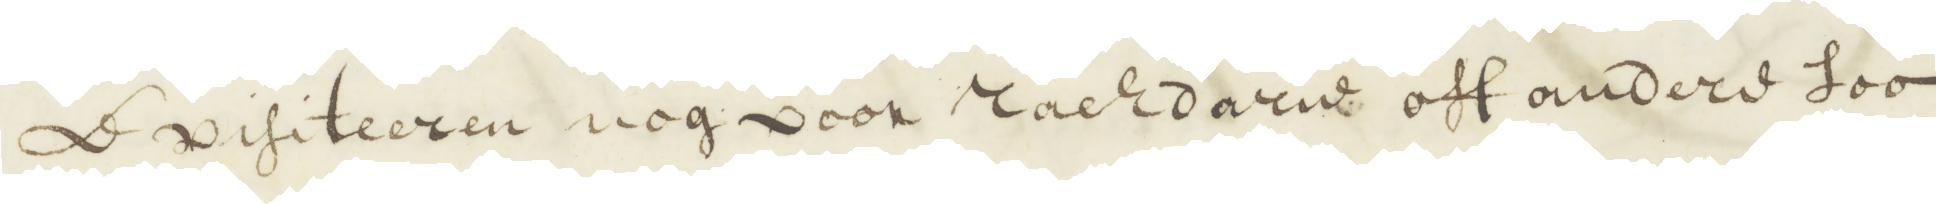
te visiteeren nog voor rachdarie off andere soo
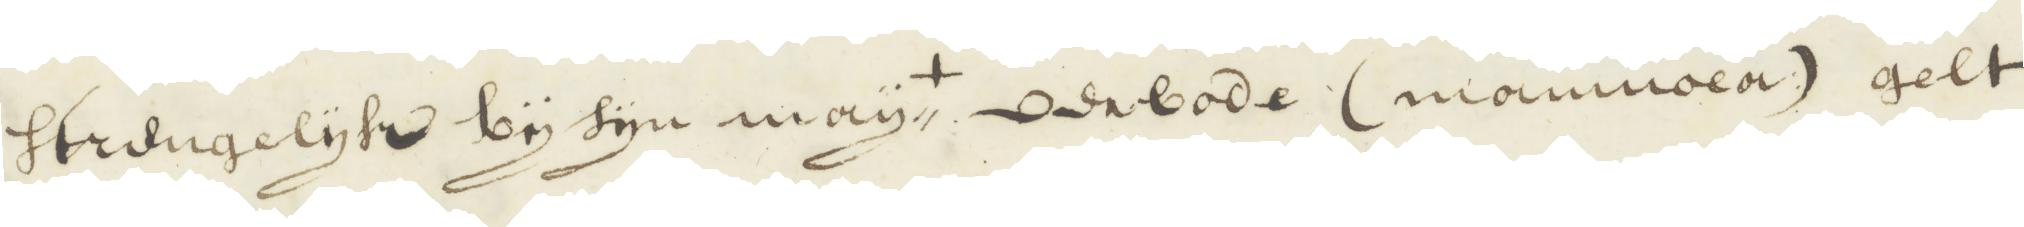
strengelijk bij sijn maij„t verbode (manmoea:) gelt
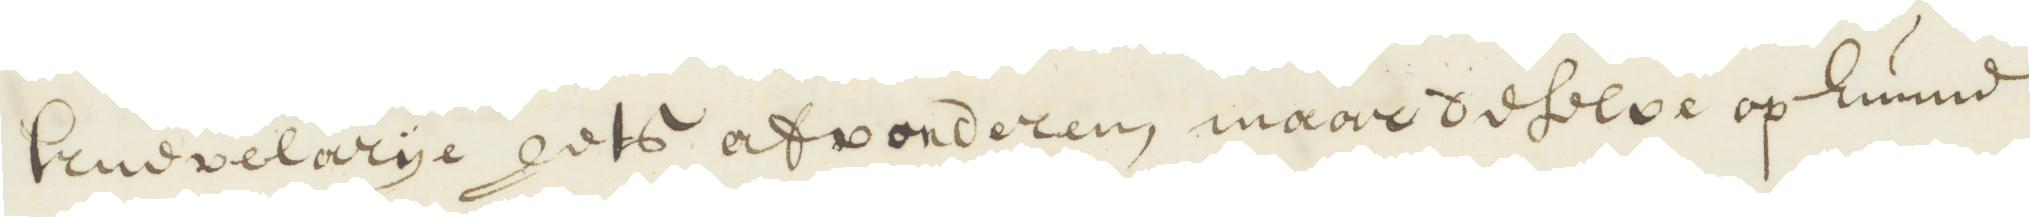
knevelarije jets afvorderen, maar deselve op hunne
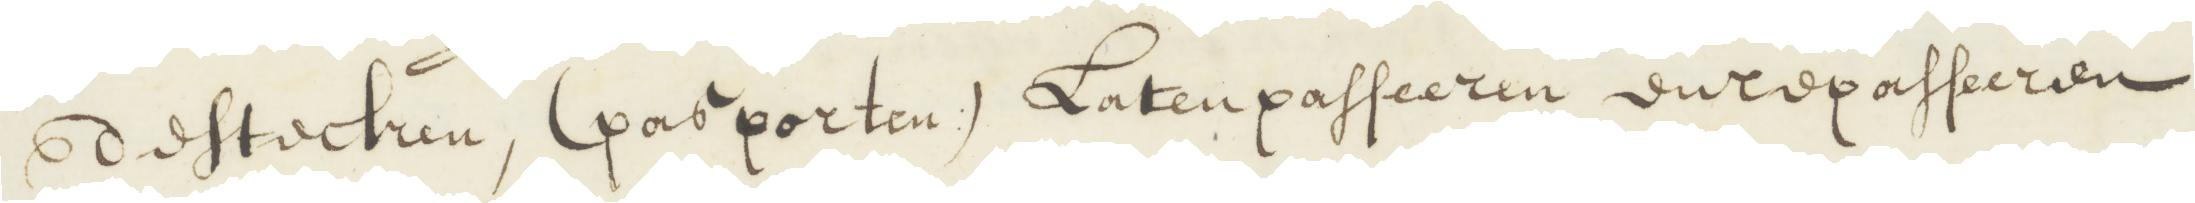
de stecken, (pasporten:) Laten passeeren en repasseeren
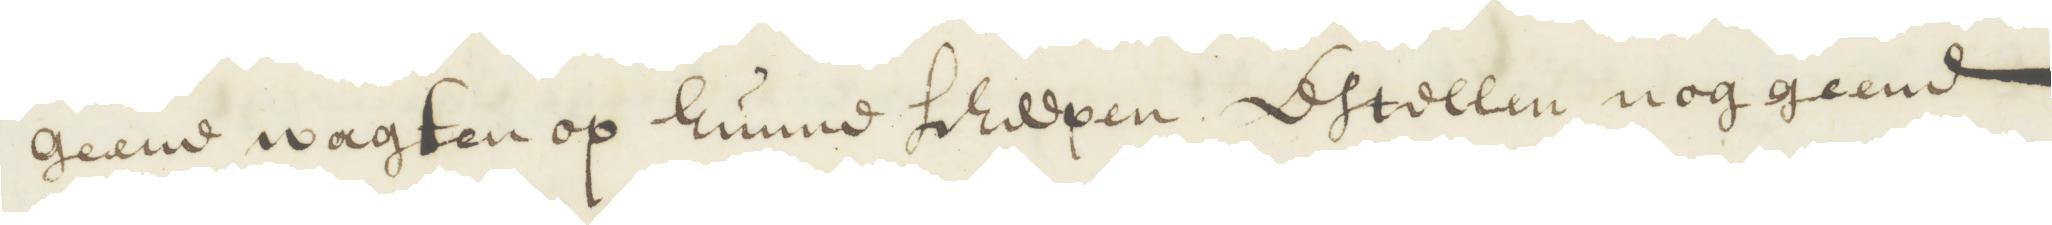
geene wagten op hunne scheepen te stellen nog geene
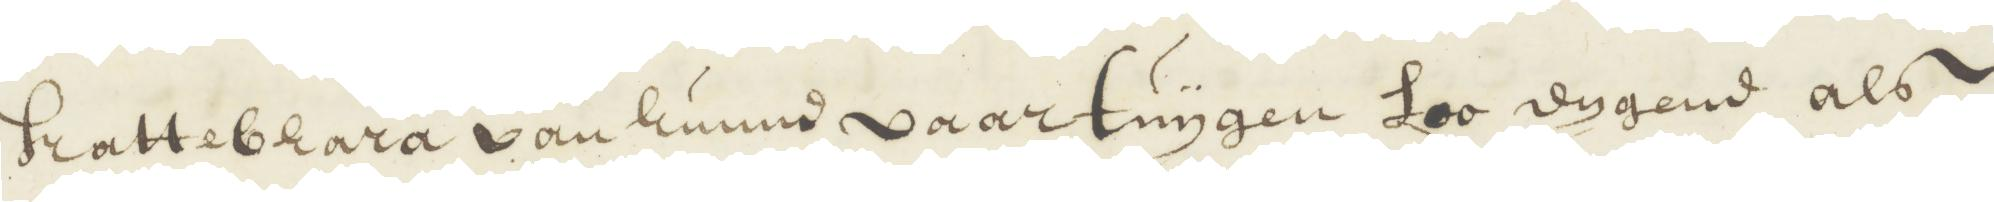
kattebhara van hunne vaartuijgen soo eygene als
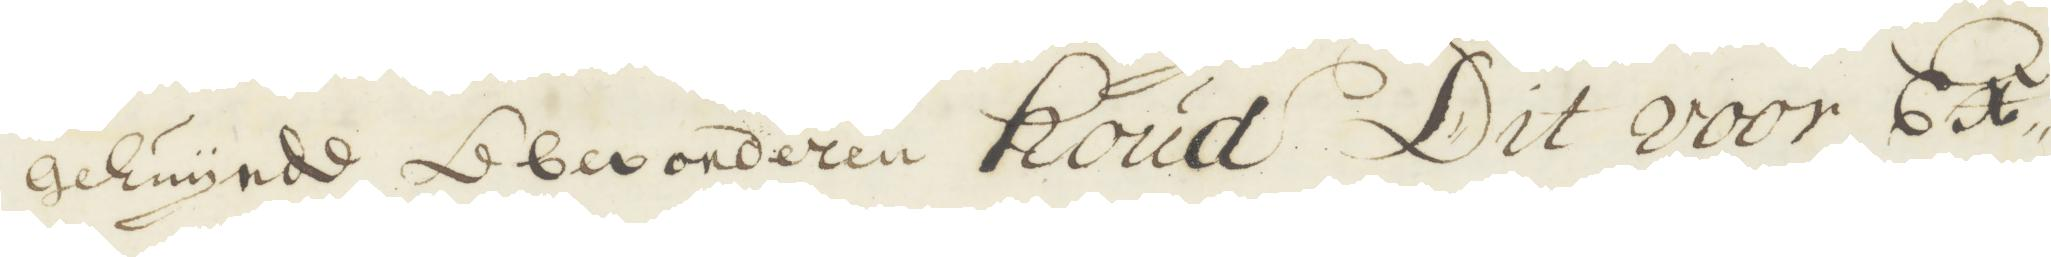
gehuijrde te bevorderen houd Dit voor Ex
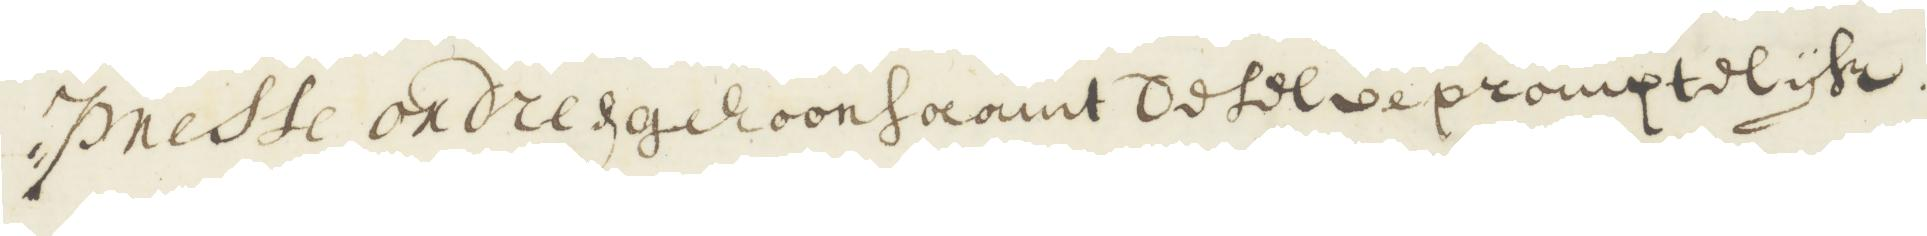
„presse ordre vergehoorsaamt deselve promptelijk
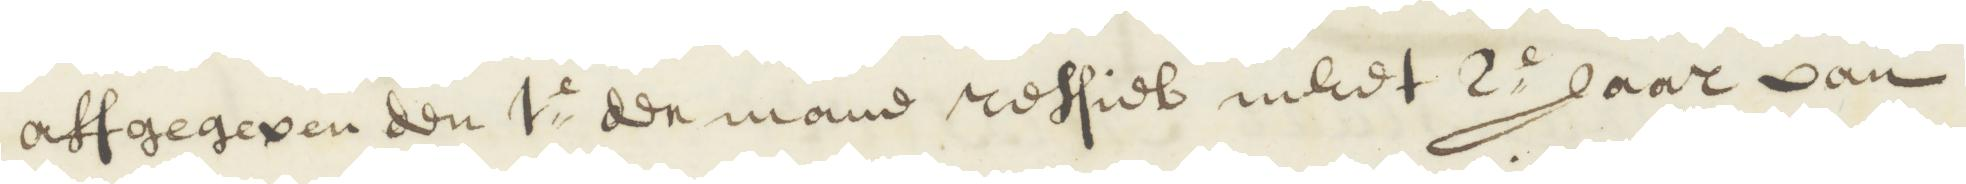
affgegeven den 1„e der mane ressieb in het 2„e Jaar van
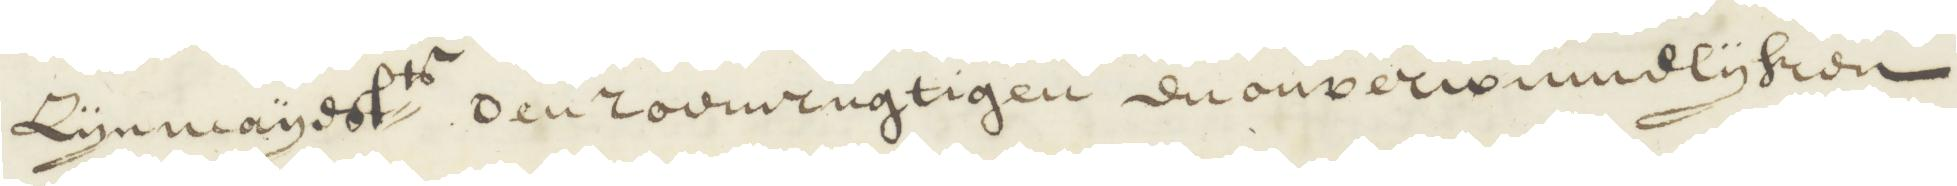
zijn maijest„ts den roemrugtigen en onverwinnelijken
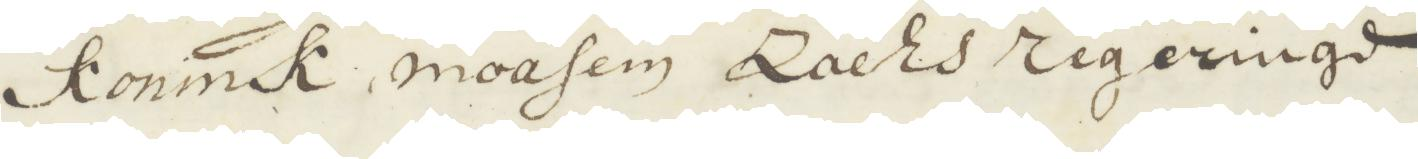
konink, moasem zaehs regeringe
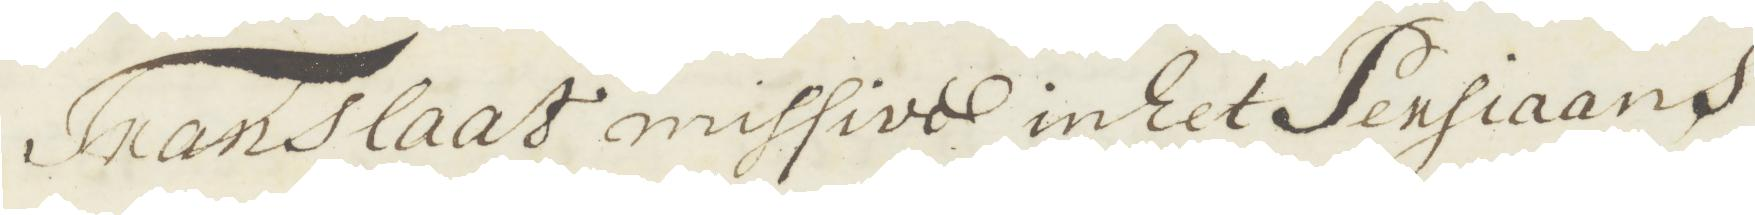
Translaat missive in het Persiaans
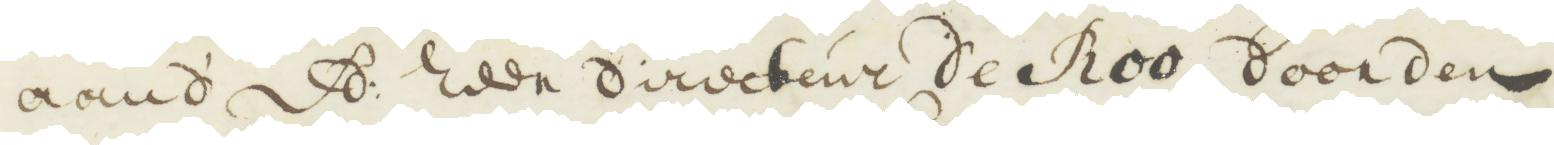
aan d’ Ed: heer directeur de Roo, door den
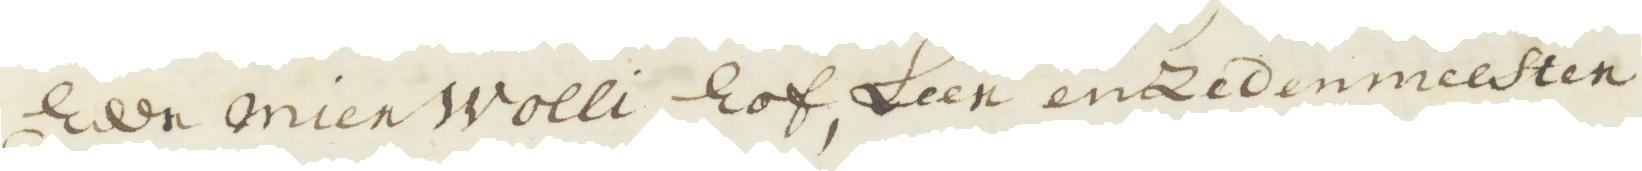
heer mier Wolli hof, leer en zedenmeester
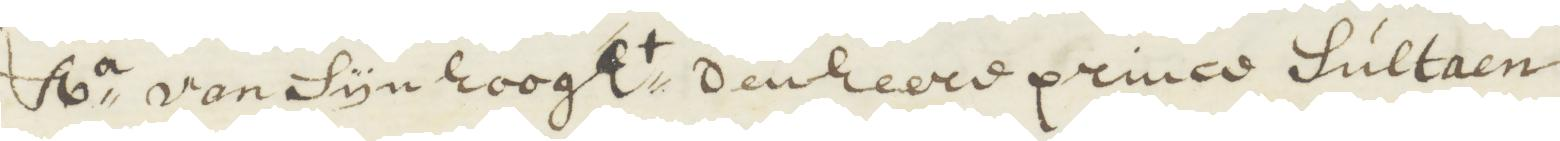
Et=a van sijn hoogh„t den heere prince sultaen
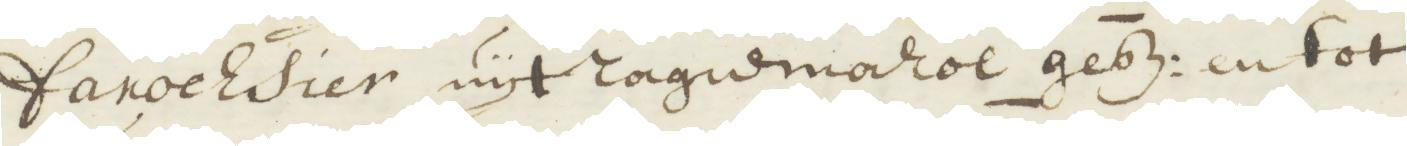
faroeh sier uijt ragiemahol gesz: en tot
